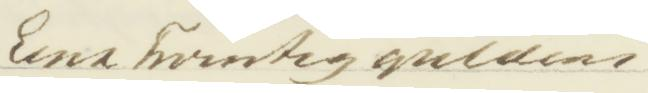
Een & Twintig guldens
